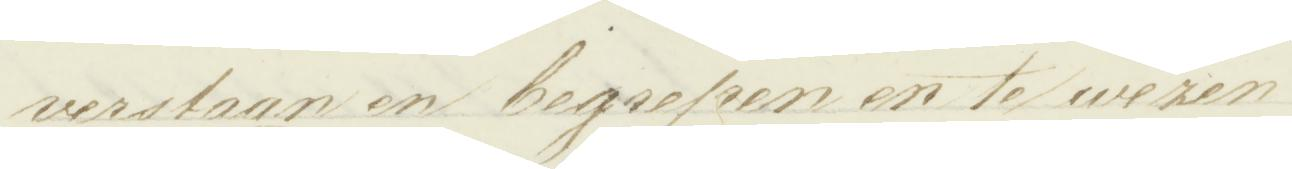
verstaan en begrepen en te wezen
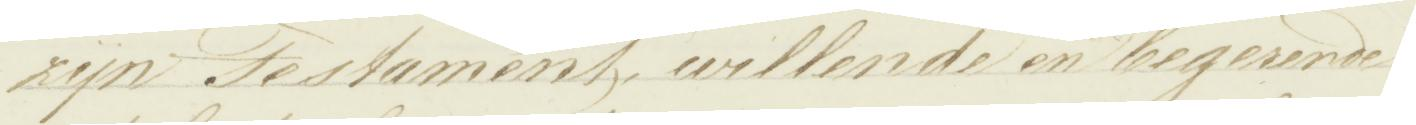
zijn Testament, willende en begerende
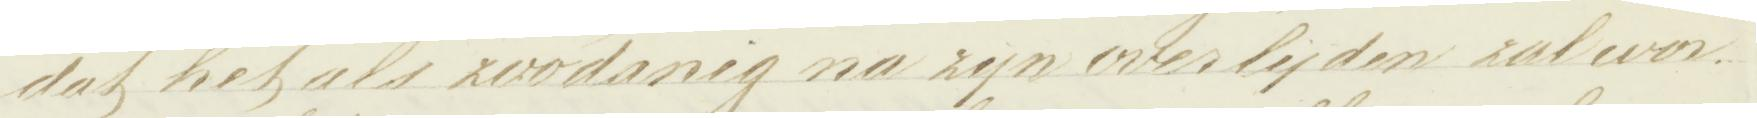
dat het als zoodanig na zyn overlijden zal wor„
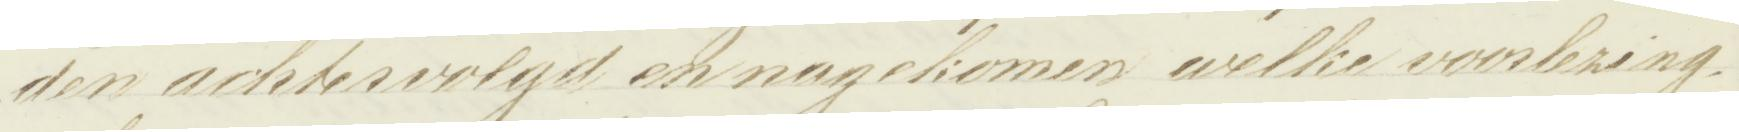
den achtervolgd en nagekomen welke voorlezing.
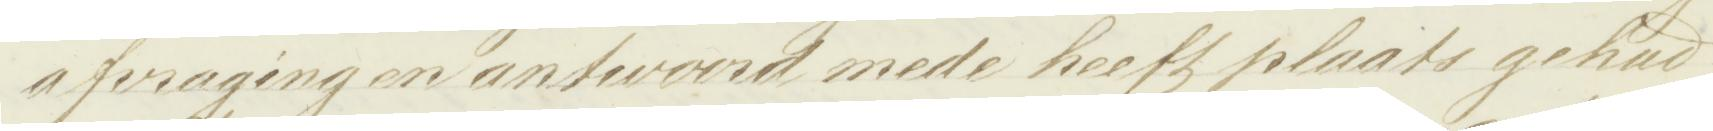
afvraging en antwoord mede heeft plaats gehad
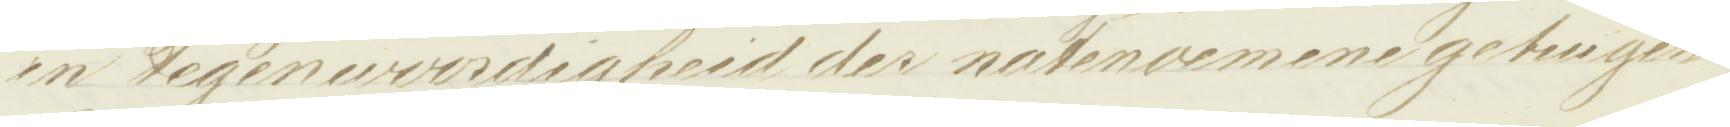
in tegenwoordigheid der natenoemene getuigen.
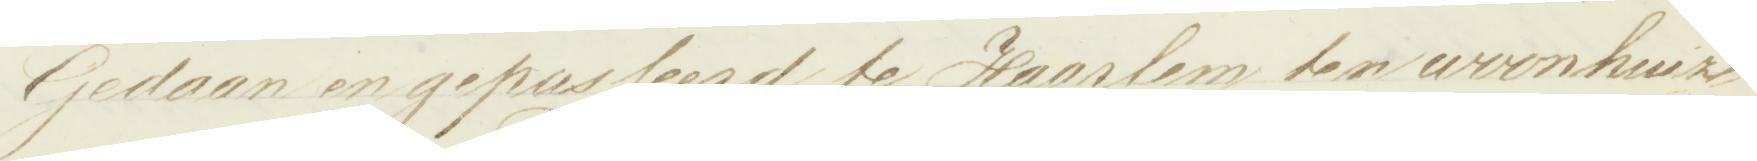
Gedaan en gepasseerd te Haarlem ten woonhuize
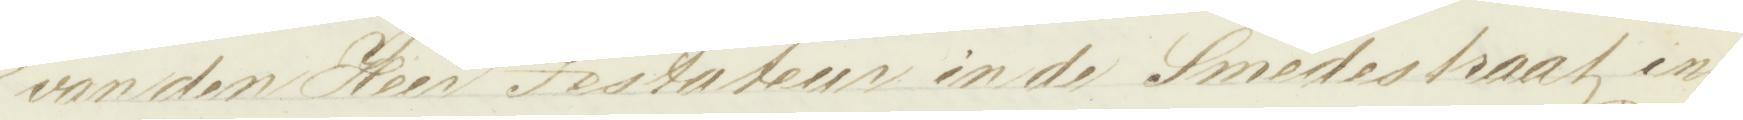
van den Heer Testateur in de Smedestraat, in
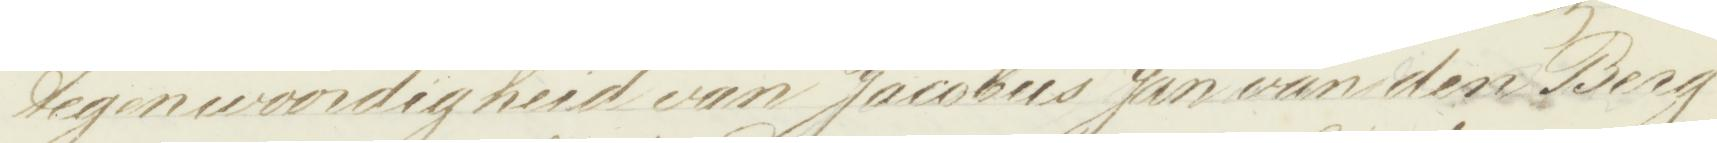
tegenwoordigheid van Jacobus Jan van den Berg
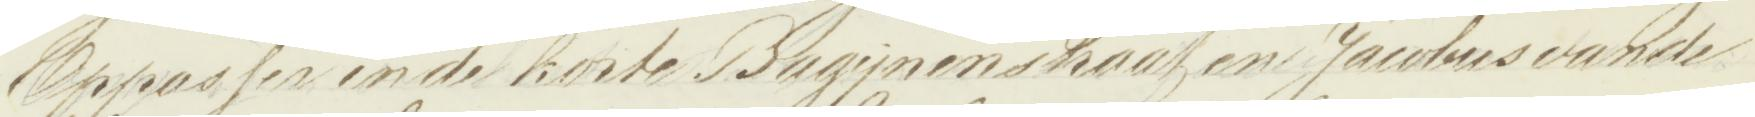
Oppasser in de korte Bagijnenstraat en Jacobus van de
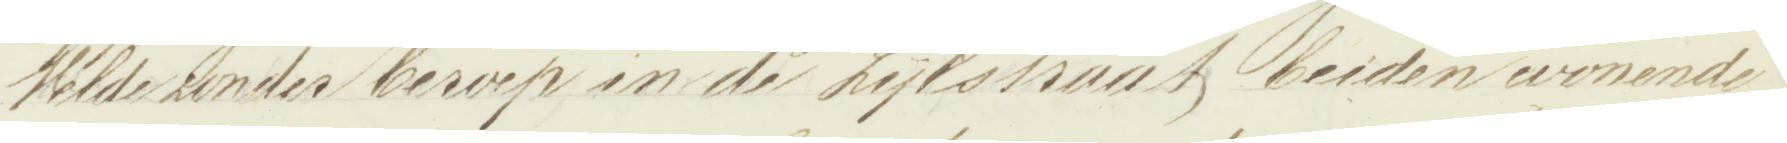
Velde zonder beroep in de Zijlstraat, beiden wonende
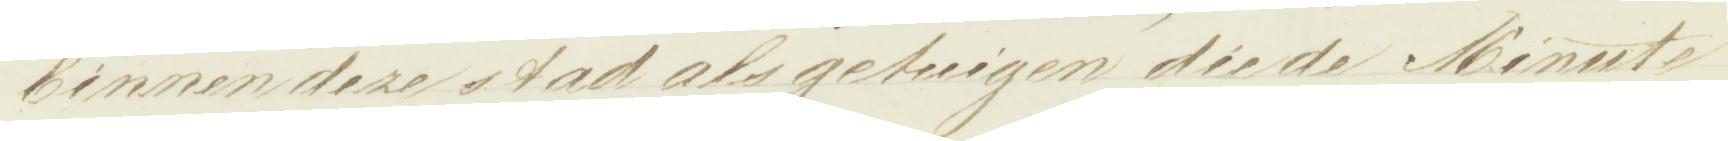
binnen deze stad als getuigen die de Minute
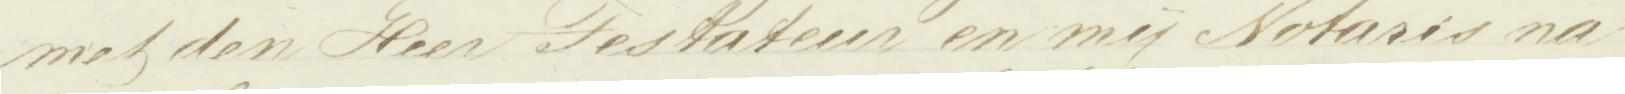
met den Heer Testateur en mij Notaris na
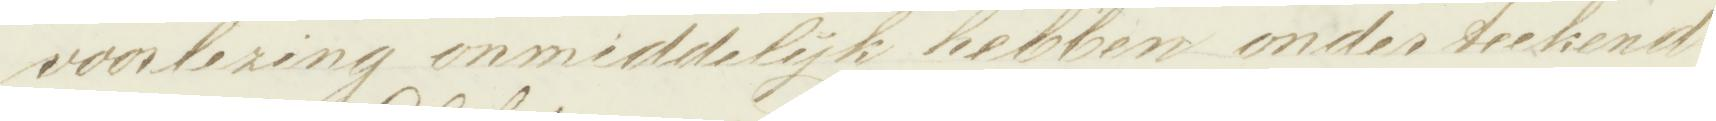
voorlezing onmiddelijk hebben onderteekend
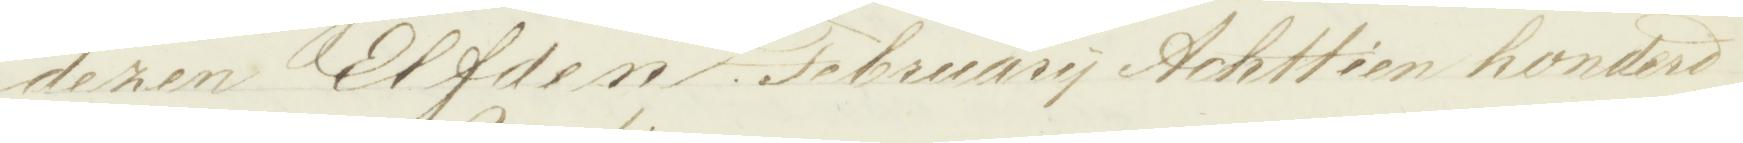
dezen Elfden Februarij Achttien honderd
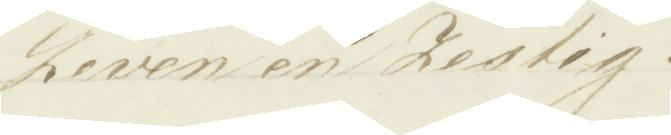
Zeven en Zestig.
